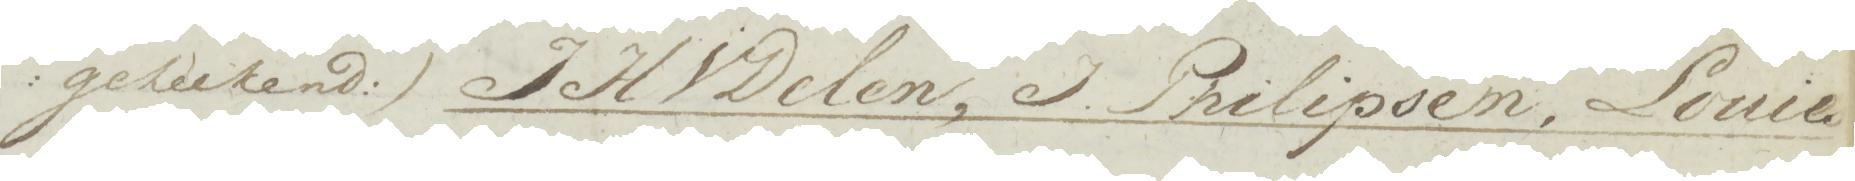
/:geteekend:) J H V Delen, J. Philipsen, Louie
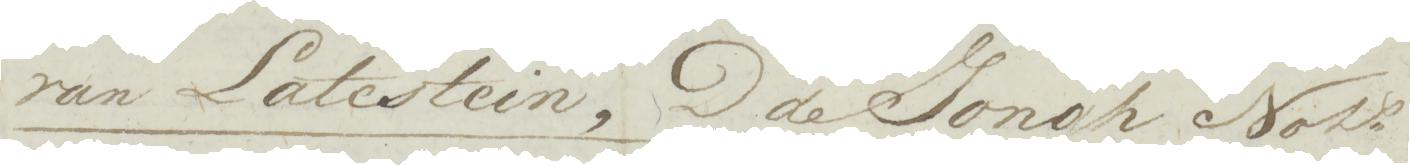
van Latestein, de Jongh Not„s
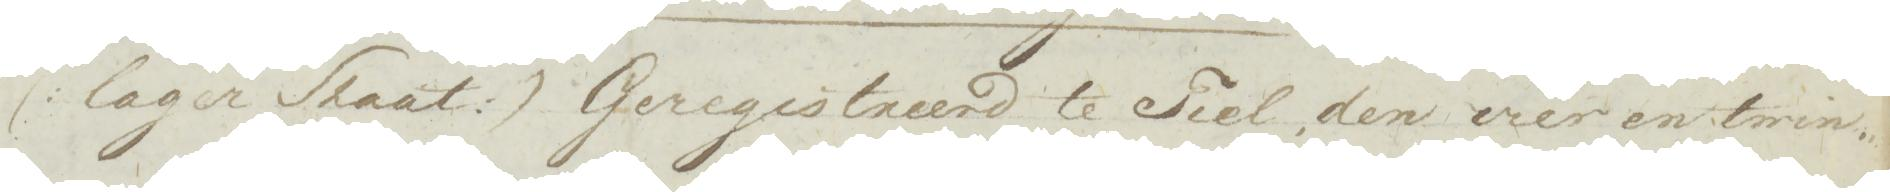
(:lager staat:) Geregistreerd te Tiel, den vier en twin„
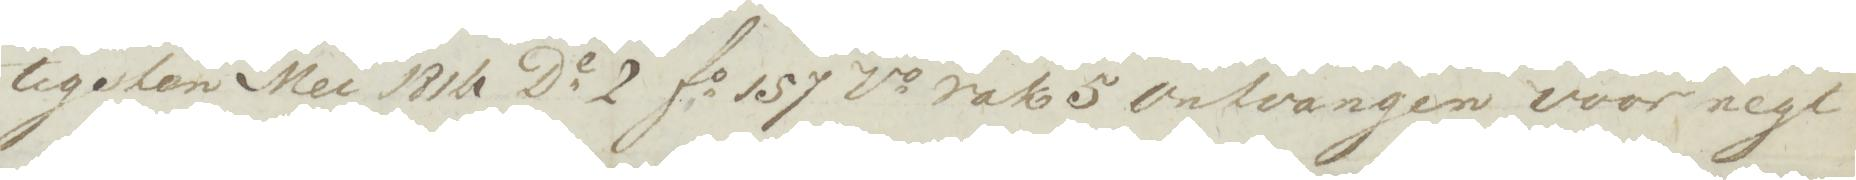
tigstan Mei 1814 D„l 2 f„o 157 v„o vak 5 ontvangen voor regt
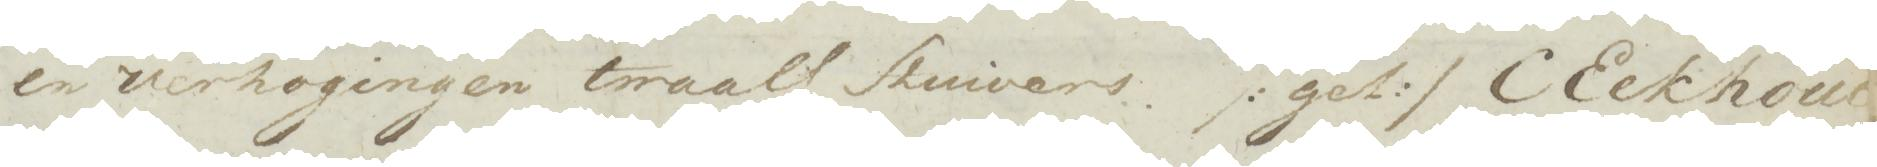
en verhogingen twaalf stuivers /:get:/ C Eekhout
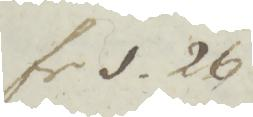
fr 1. 26
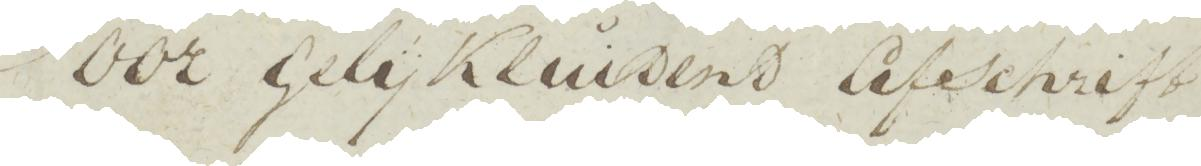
Voor gelijkluidend Afschrift
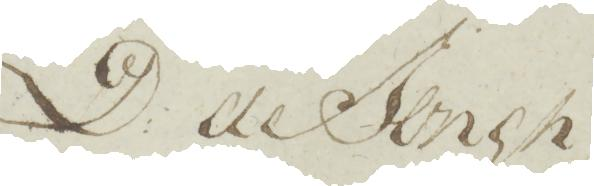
D: de Jongh
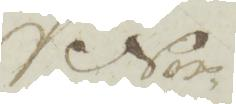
Not„s
